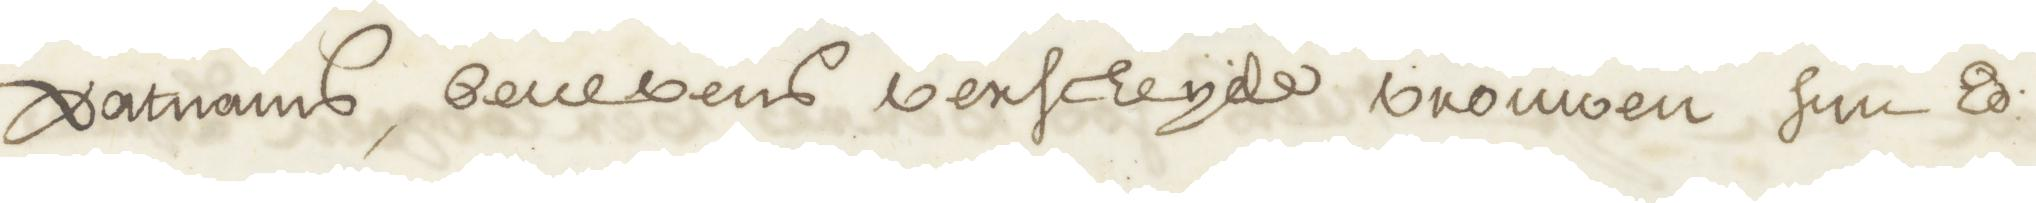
patnams, benevens verscheijde vrouwen syn Ed:
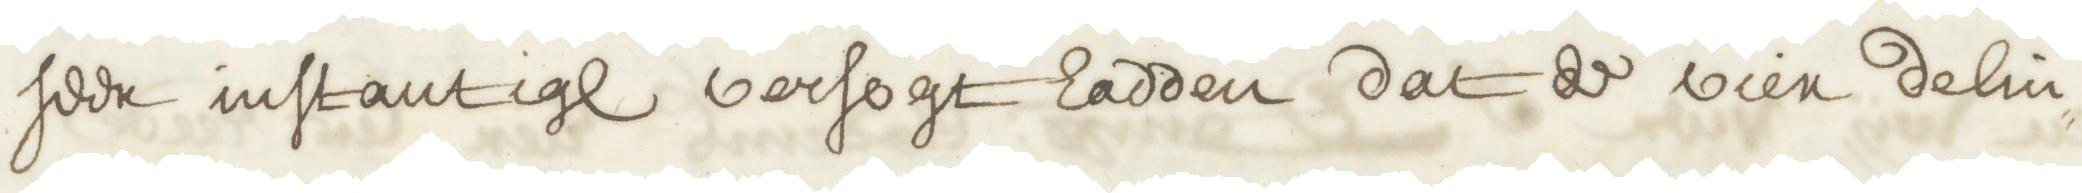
seer instantigh versogt hadden dat de vier delin„
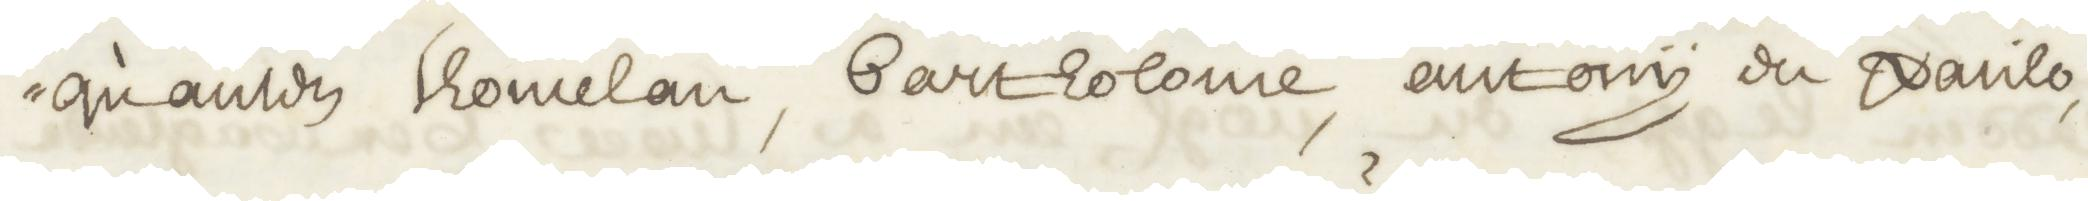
„quanten thomelan, bartholome, antonij en paulo„
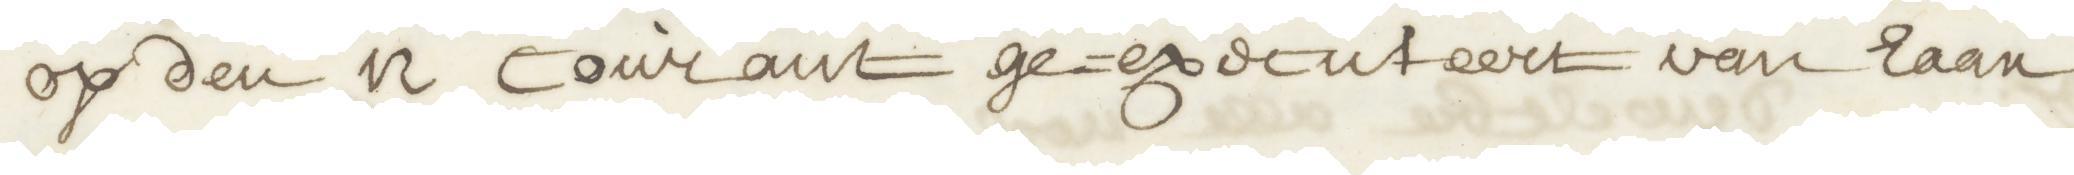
op den 12 courant ge=executeert van haar
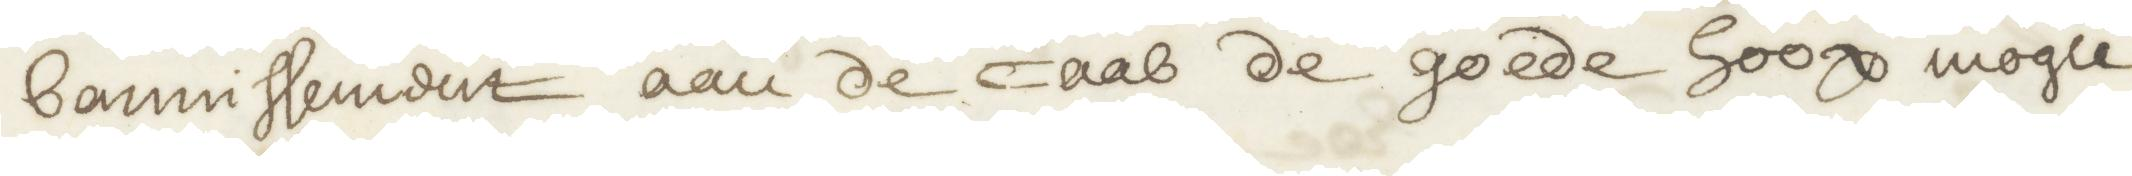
bannissement aan de caab de goede hoop mogte
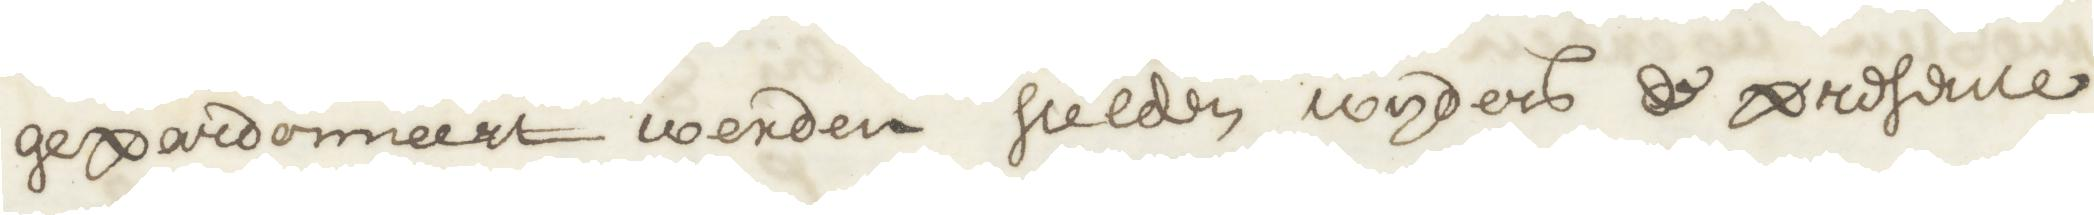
gepardonneert werden stelden wijders de presente
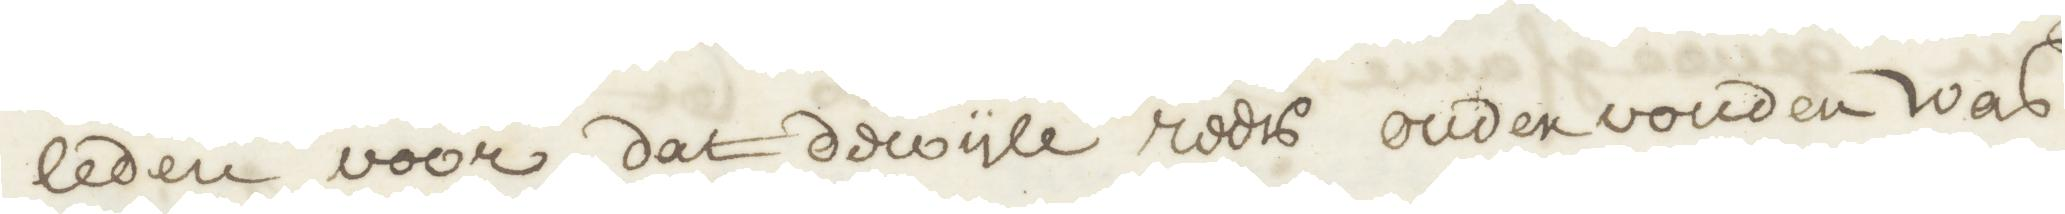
leden voor dat dewijle reeds ondervonden was
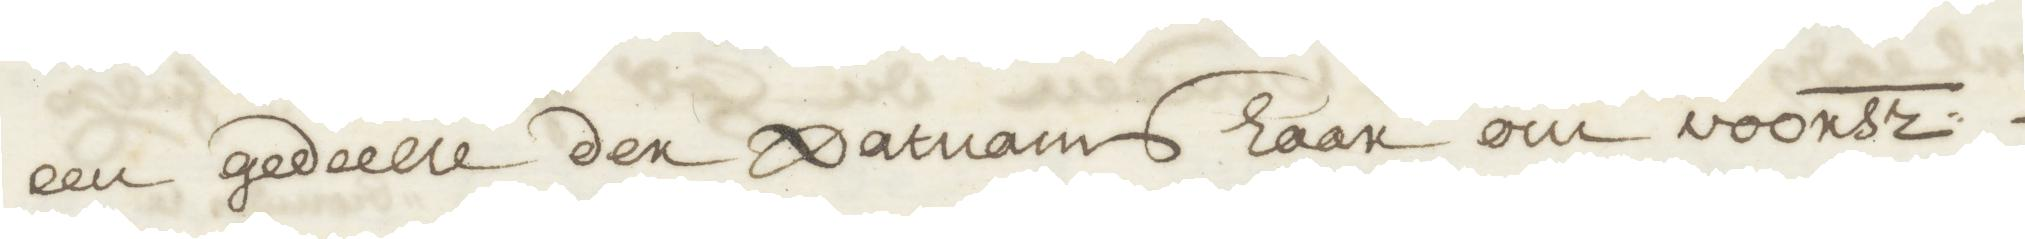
een gedeelte der patnams haar om voorsz:
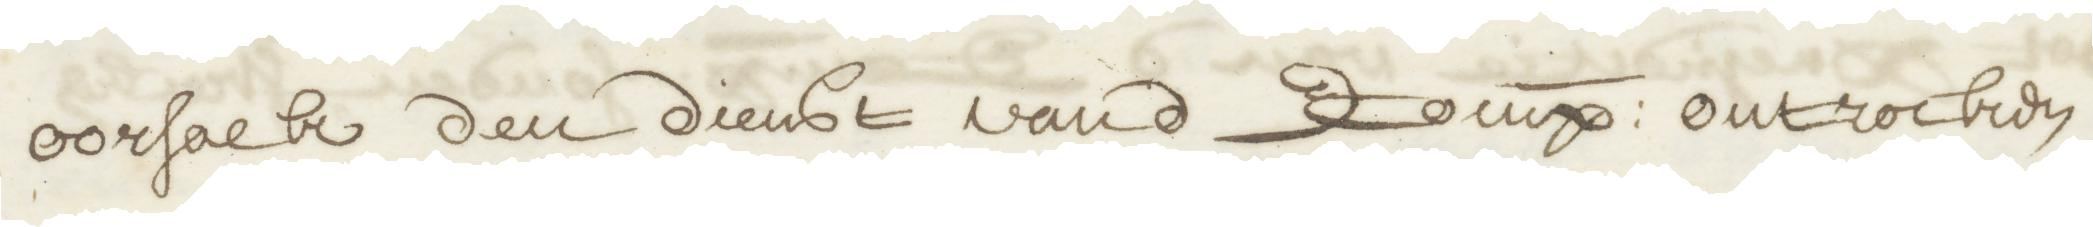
oorsaek den dienst van d Ecomp: ontrocken
